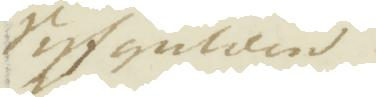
Vyf gulden
